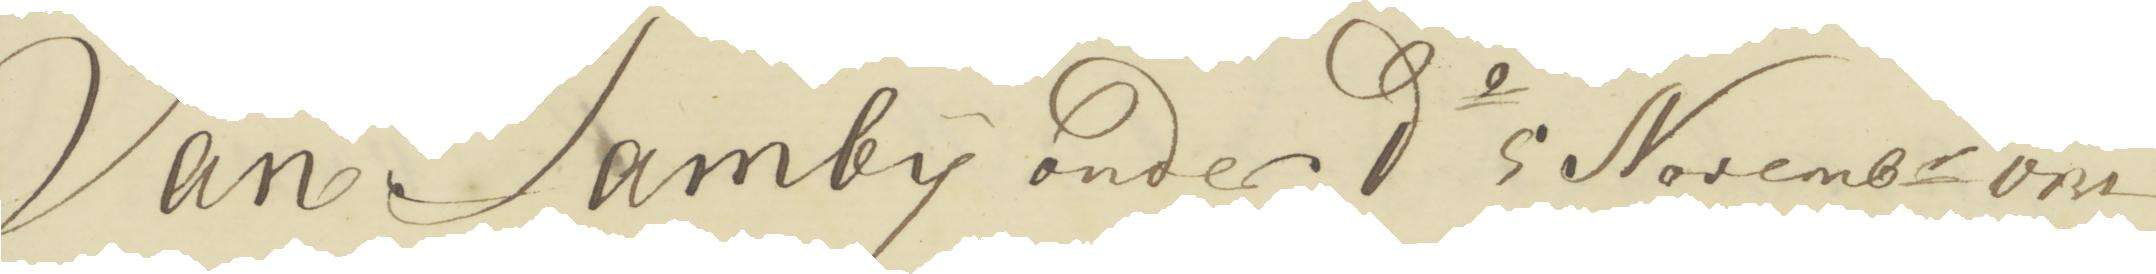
Van Jambij ondes d=o 5 Novemb=r om
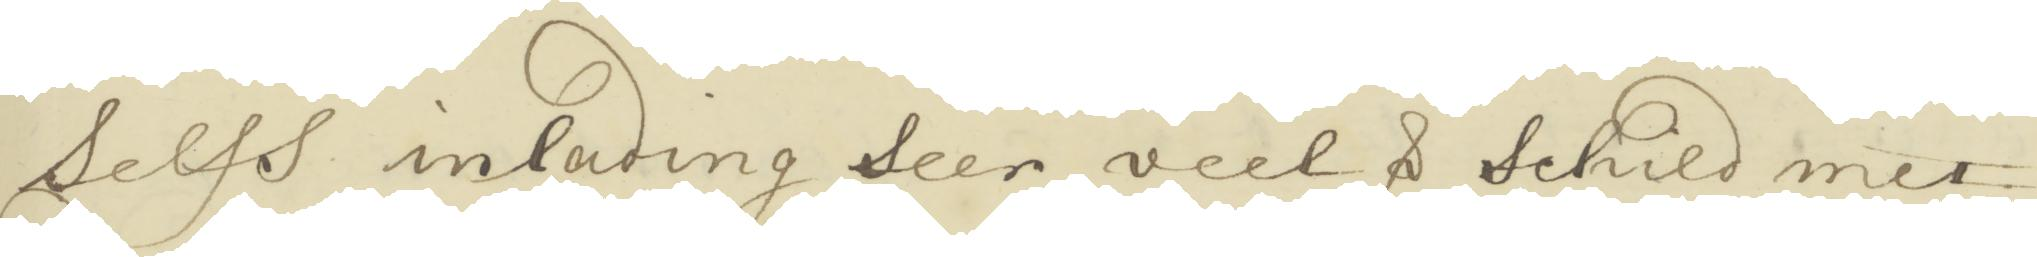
selfs inlading seer veel ver schild met
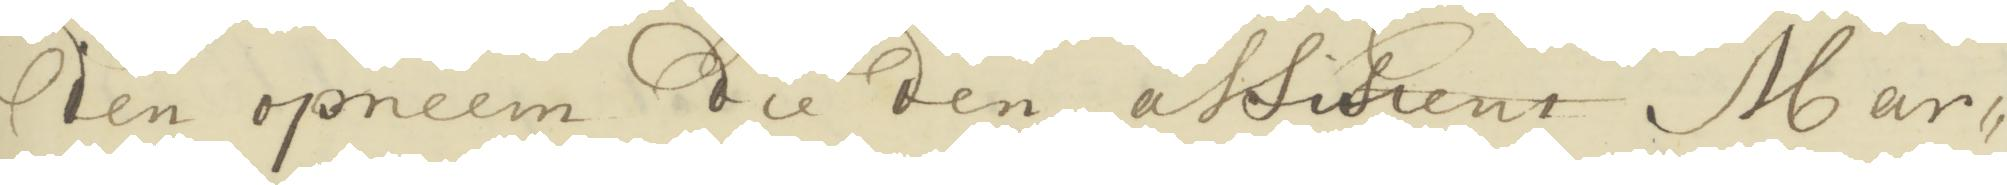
den opneem die den assistent Mar„
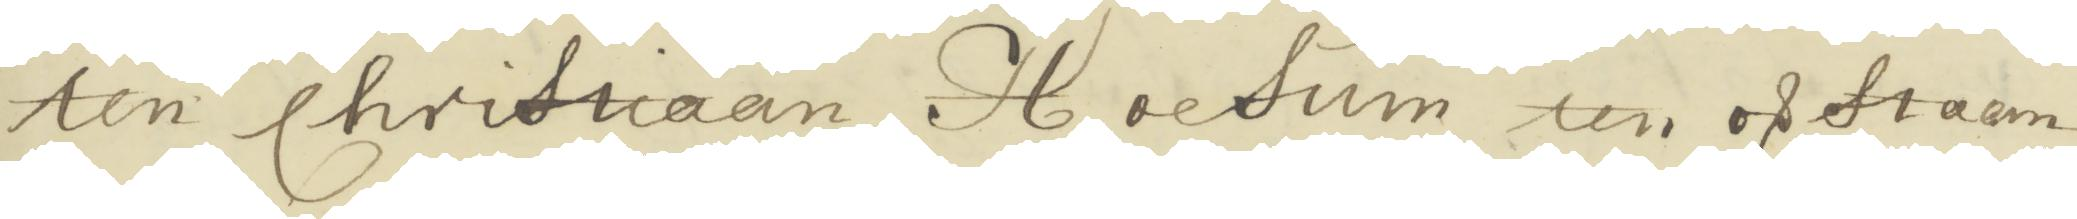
ten Christiaan Hoesum ten overstaan
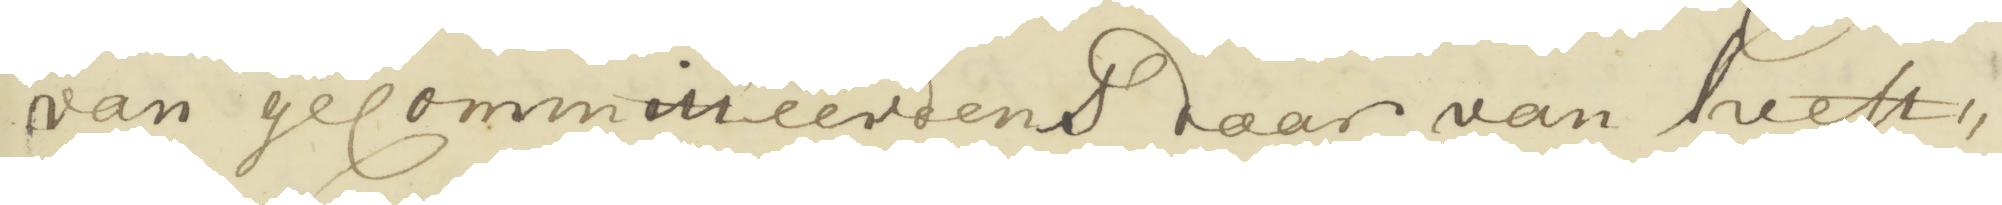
van gecommitteerdens daar van heeft„
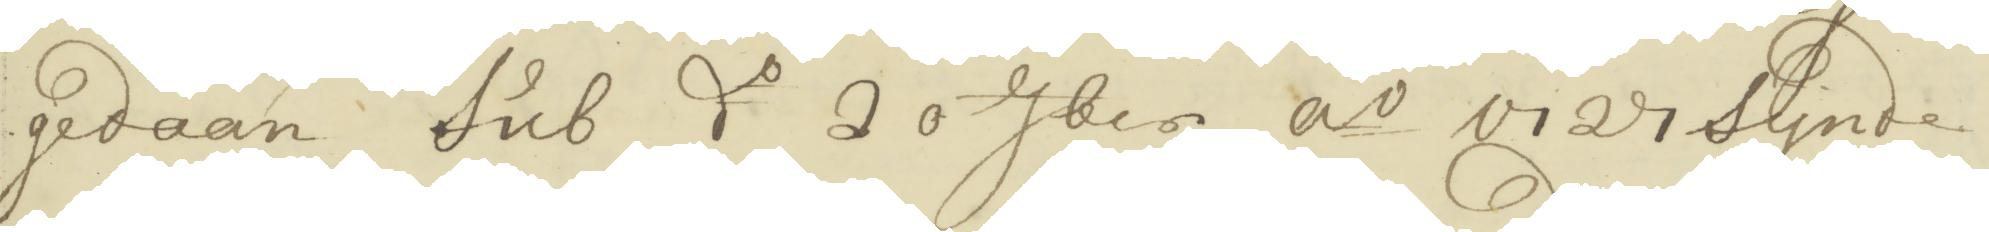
gedaan sub d=o 20 7ber a=o 1727 sijnde
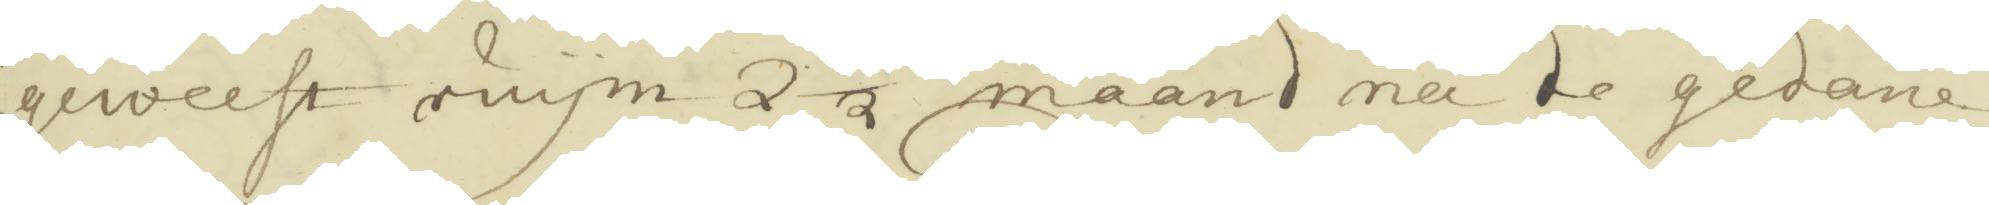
geweest ruijm 2½ maand na de gedane
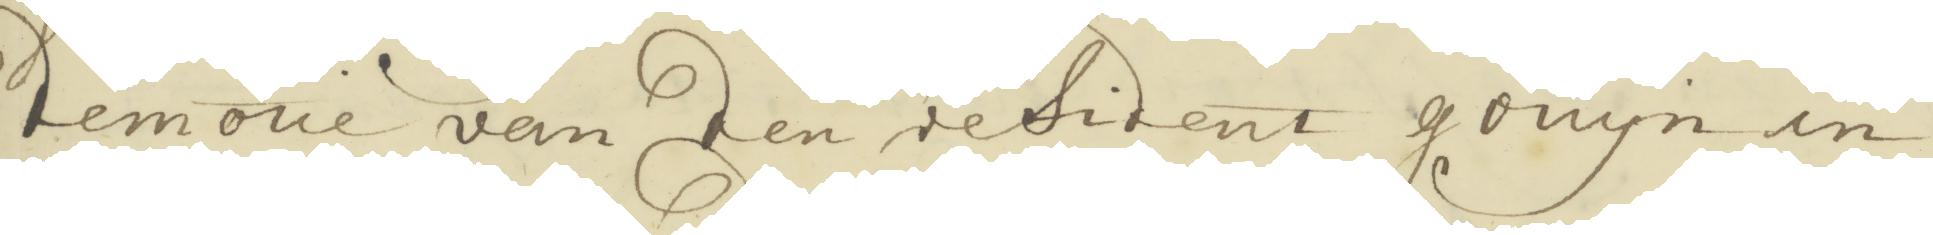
demotie van den resident gouijn in
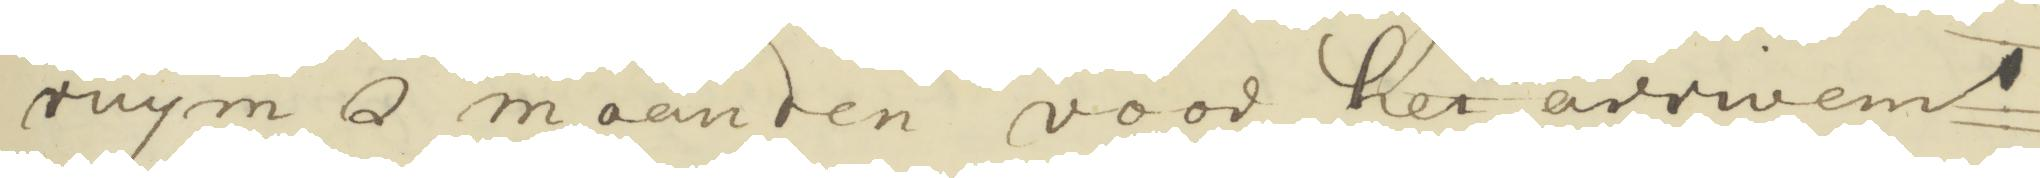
ruijm 2 maanden voor het arrivem=t
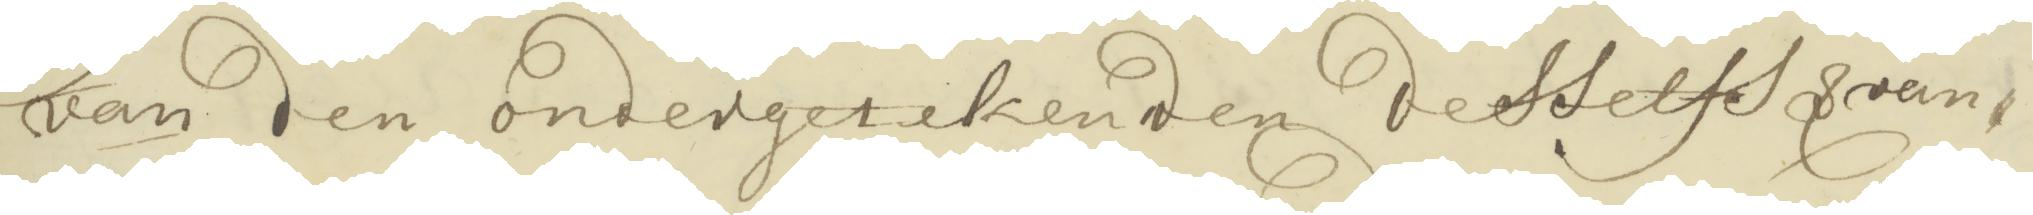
van den ondergetekenden desselfs vervan„
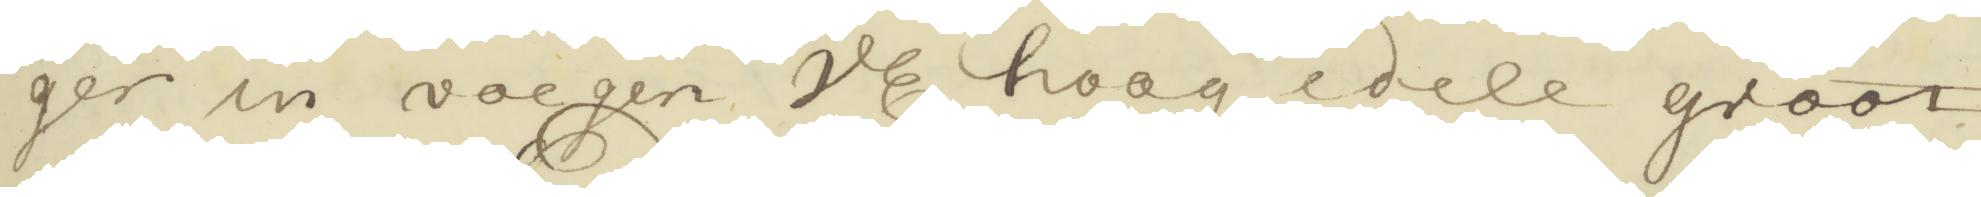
ger in voegen UE hoog edele groot
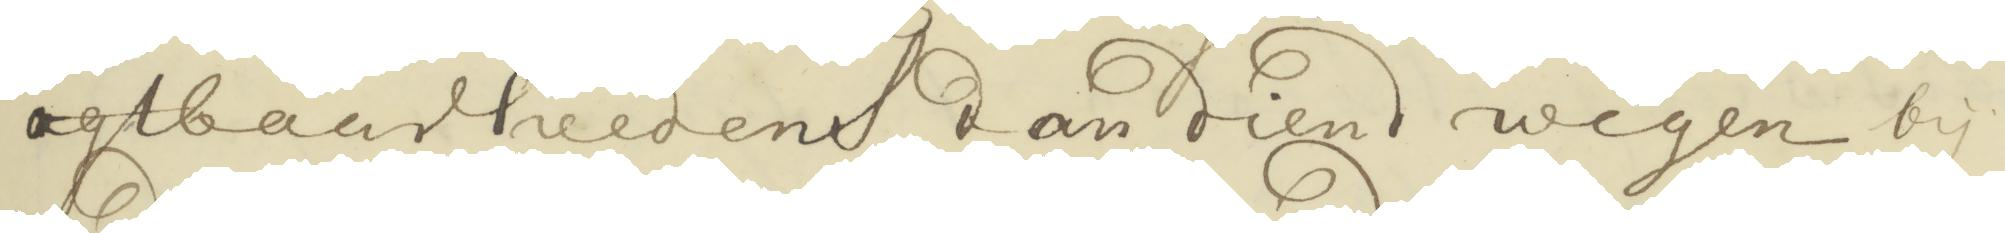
agtbaarheedens dan diend wegen bij
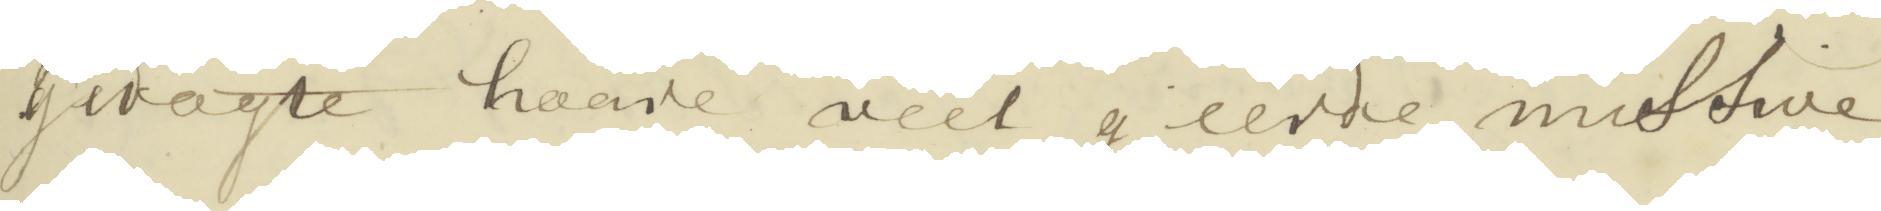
gedagte haare veel g'eerde missive
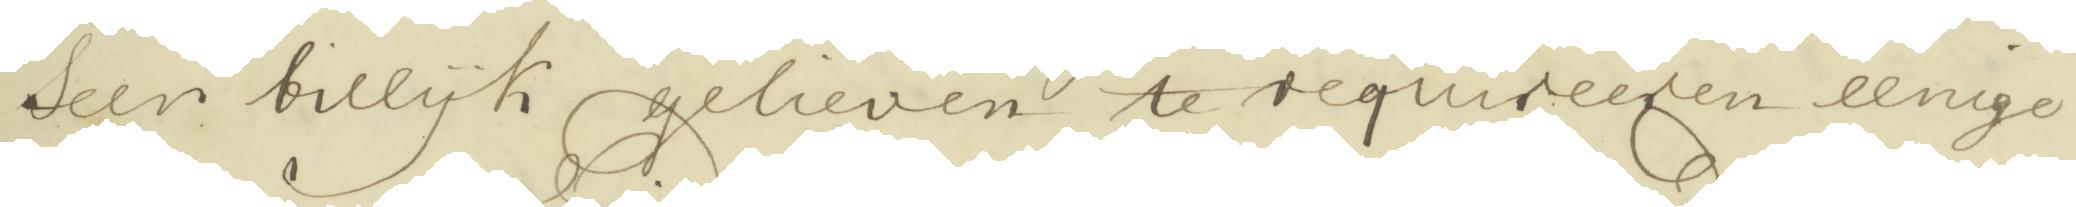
seer billijk gelieven te requireeren eenige
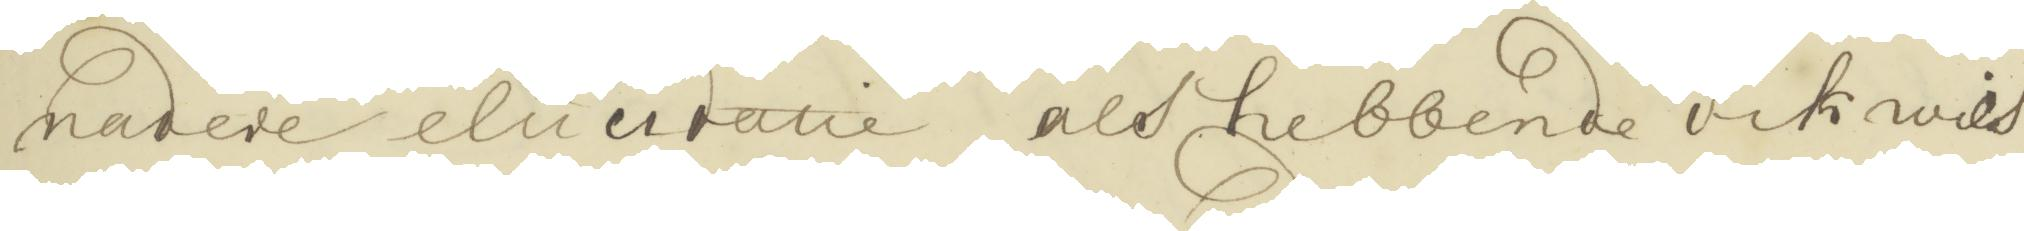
nadere elucidatie als hebbende dikwils
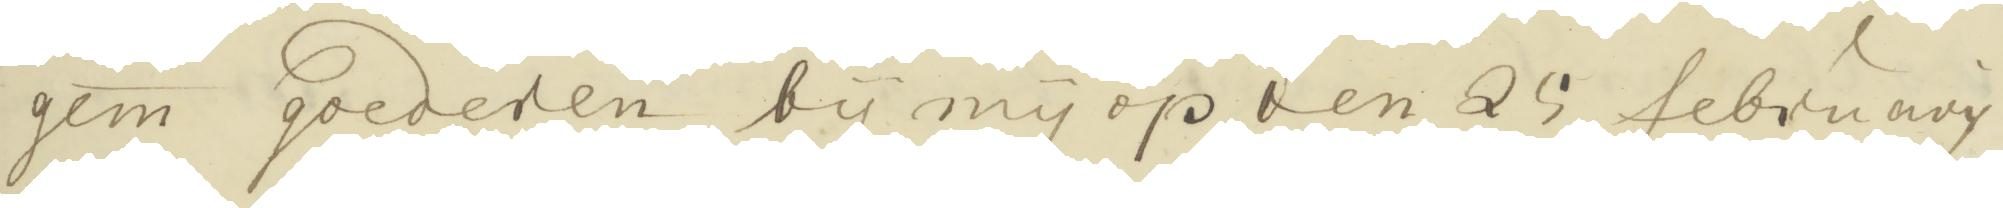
gem goederen bij mij op den 25 februarij
